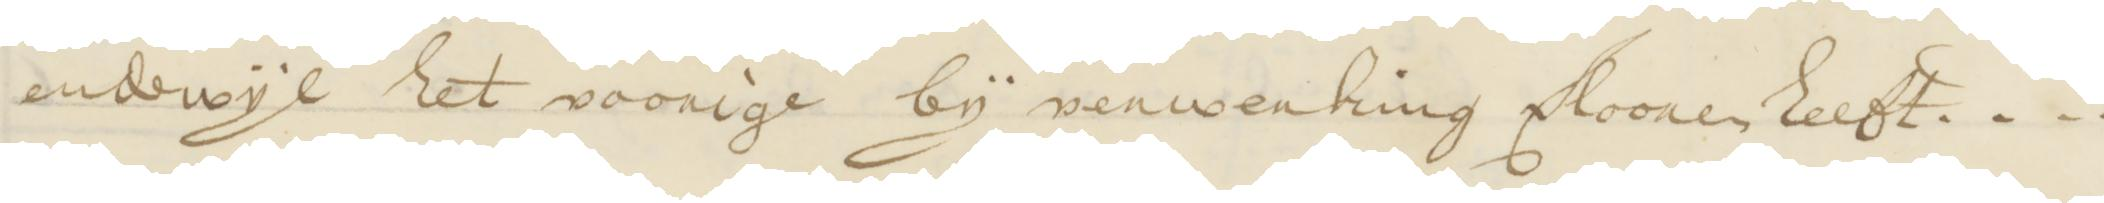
en dewijl het voorige bij verwerking verlooren heeft
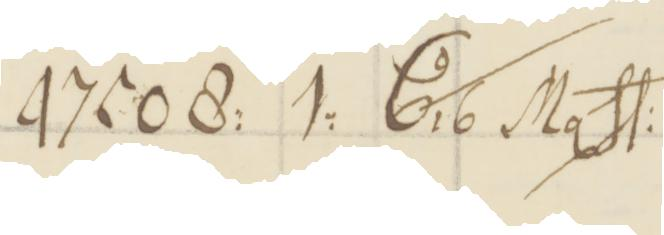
47508: 1: 6 9/16 Mq St:
